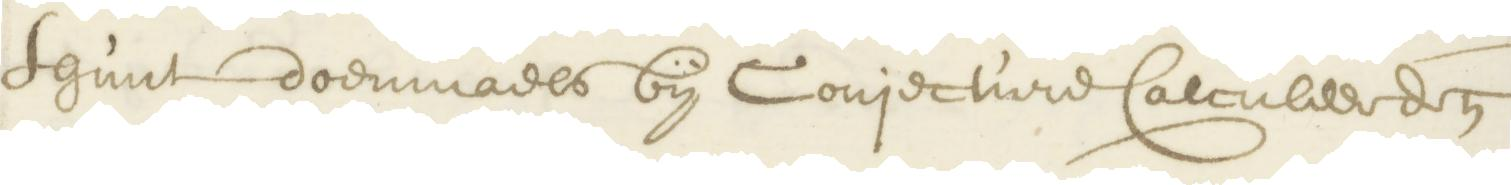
tgunt doenmaels bij Conjecture Calculeerden
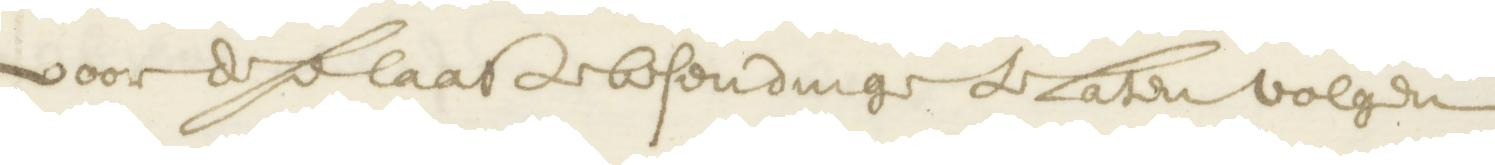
voor de plaas te besending te laten volgen
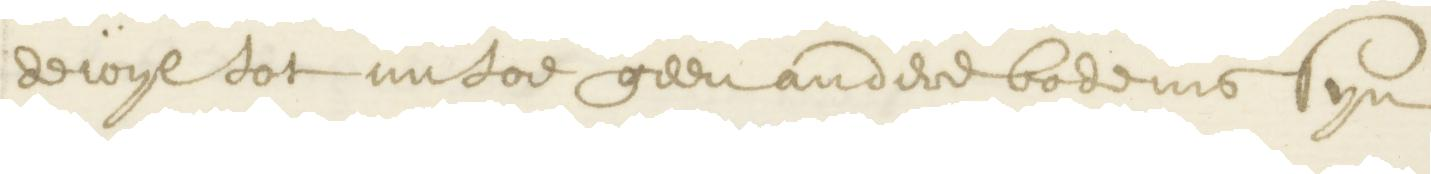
dewijl tot nu toe geen andere bodems sijn
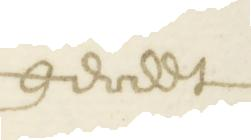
gereet
